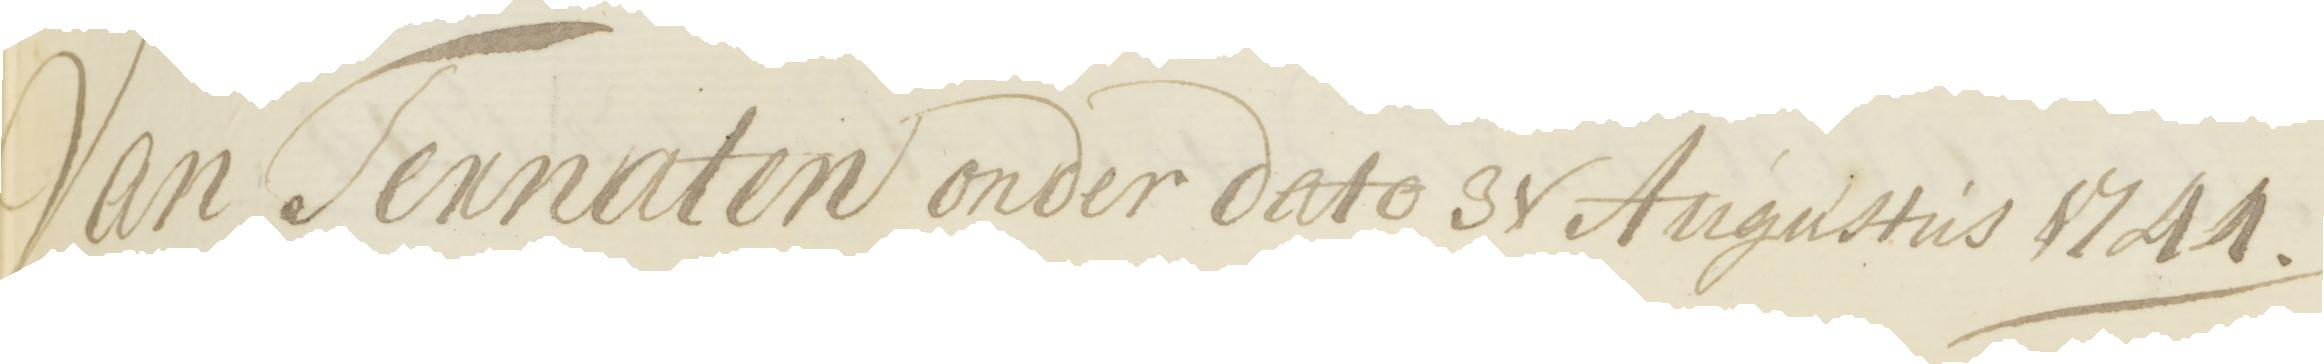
Van Ternaten onder dato 31 Augustus 1744.
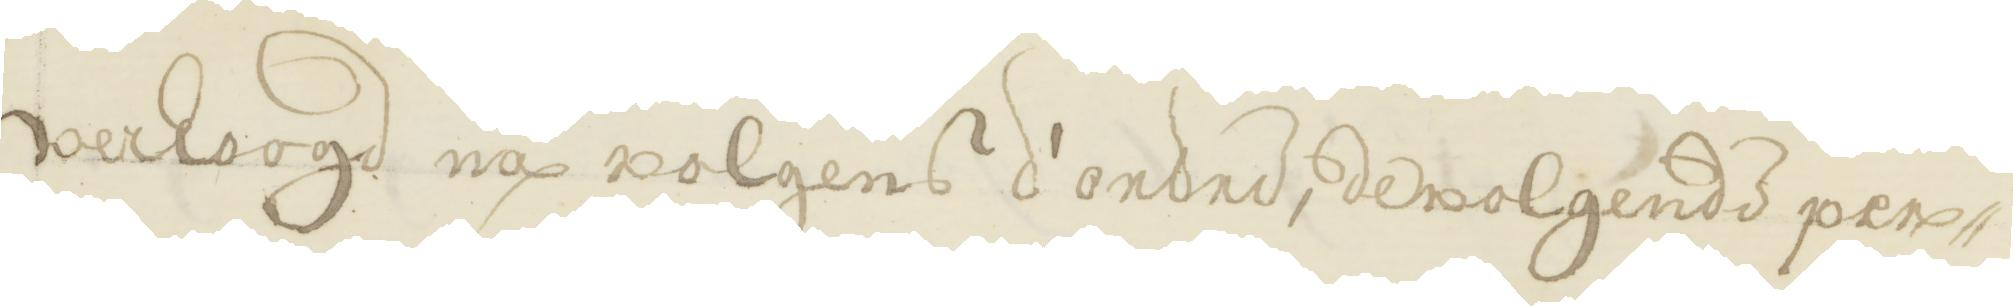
verhoogd na volgens d’ordre, de volgende per„
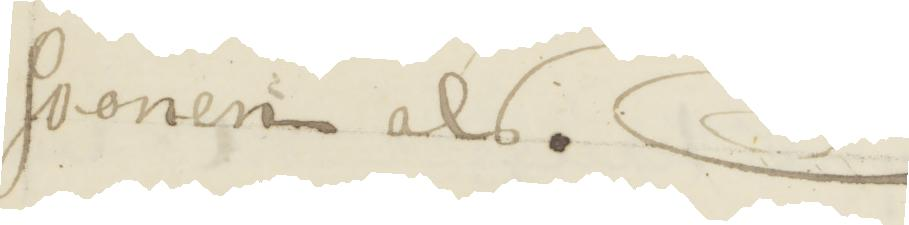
soonen als.
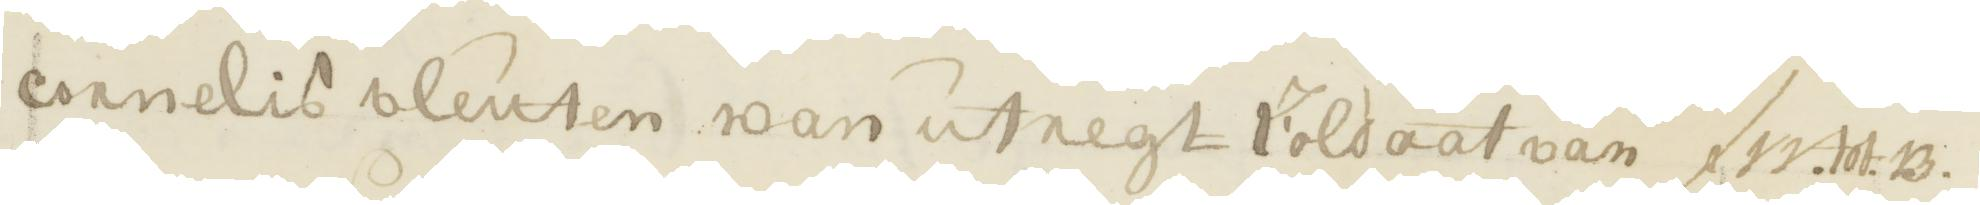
cornelis vleuten van utregt zoldaat van ƒ11. tot.13.
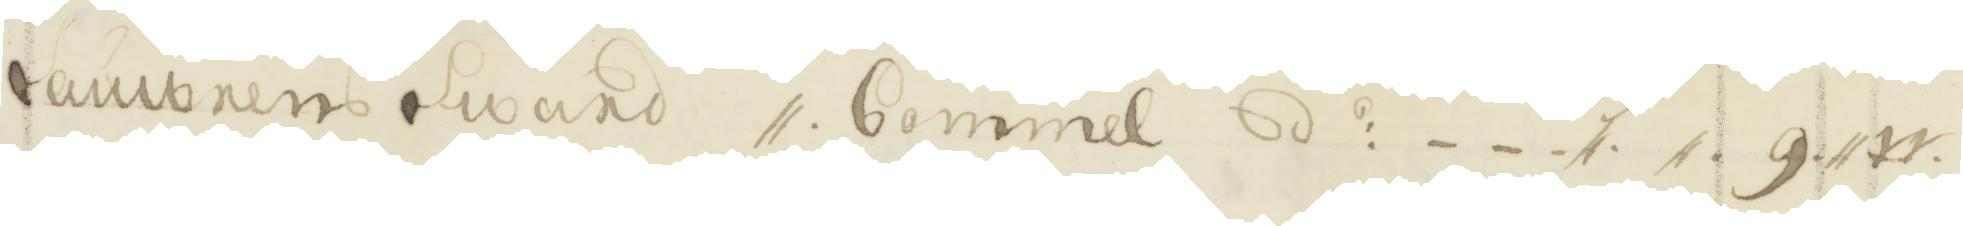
Lauwrens sward „. bommel d:o - - - „ . „ . 9. „ 11.
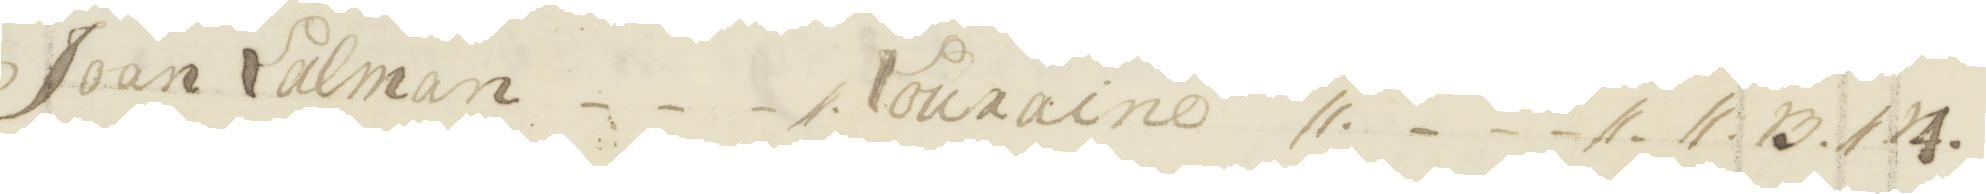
Joan Lalman - - - „. Louraine „. - - - „ . „ . 13. „ 14.
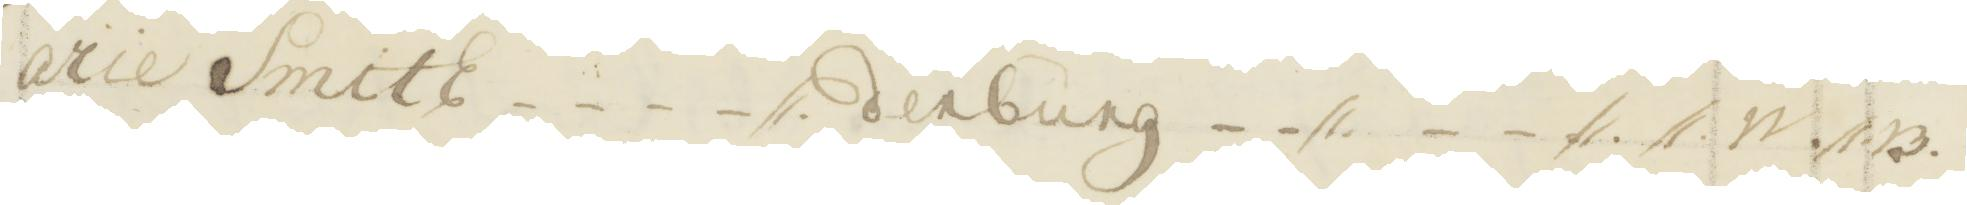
arie Smits - - - - „. derburg - - „. - - „ . „ . 11. „. 13.
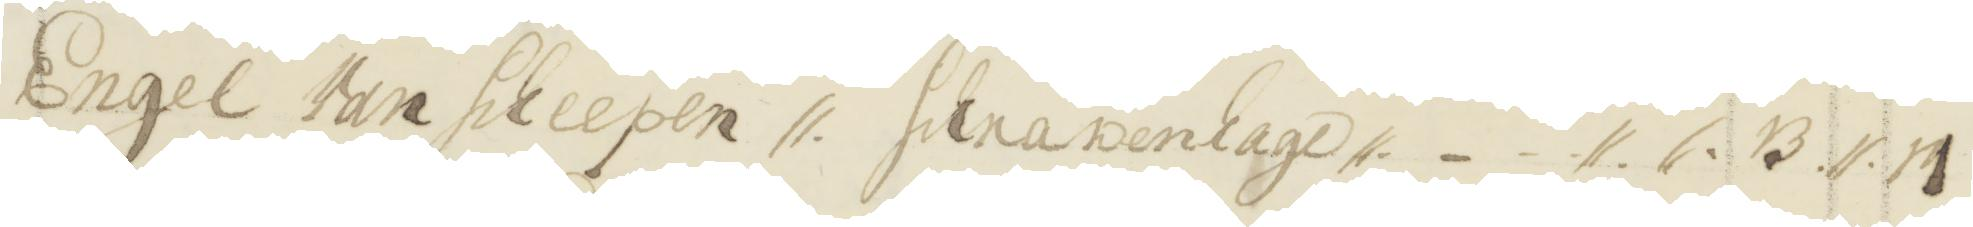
Engel van scheepen „. schravenhage „ - - - - „ . „ . 13. „. 14
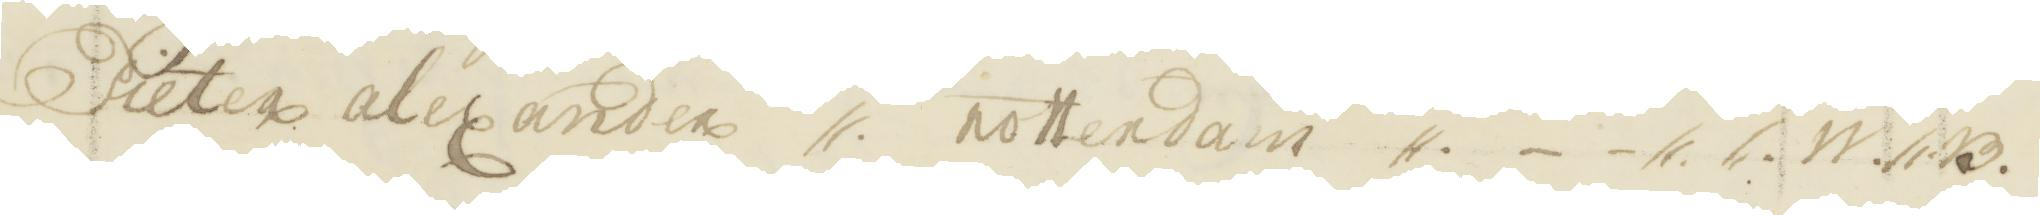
Pieter alexander „. rotterdam „. - - „. „. 11. „. 13.
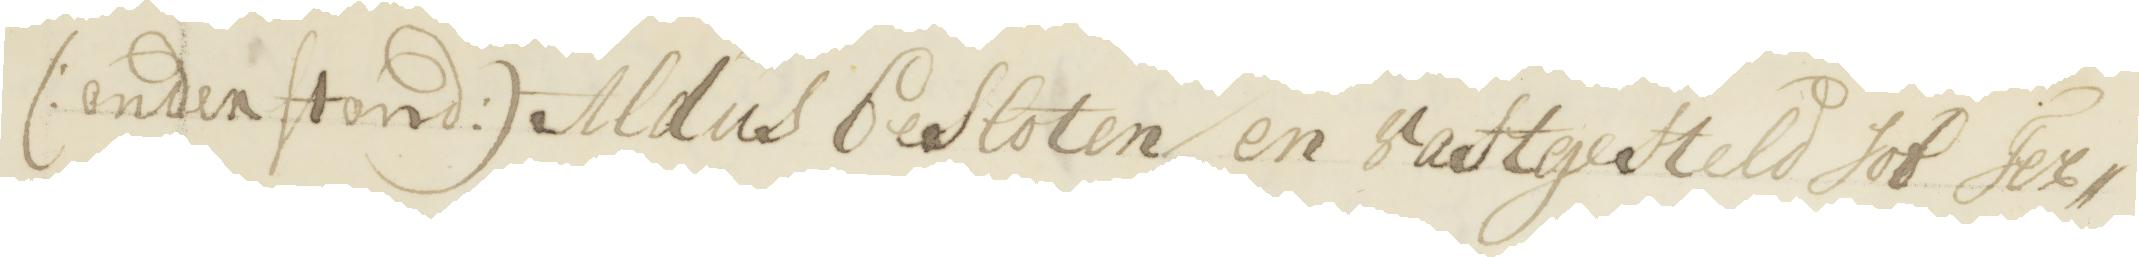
(:onderstond:) Aldus besloten en vastgesteld tot Ter„
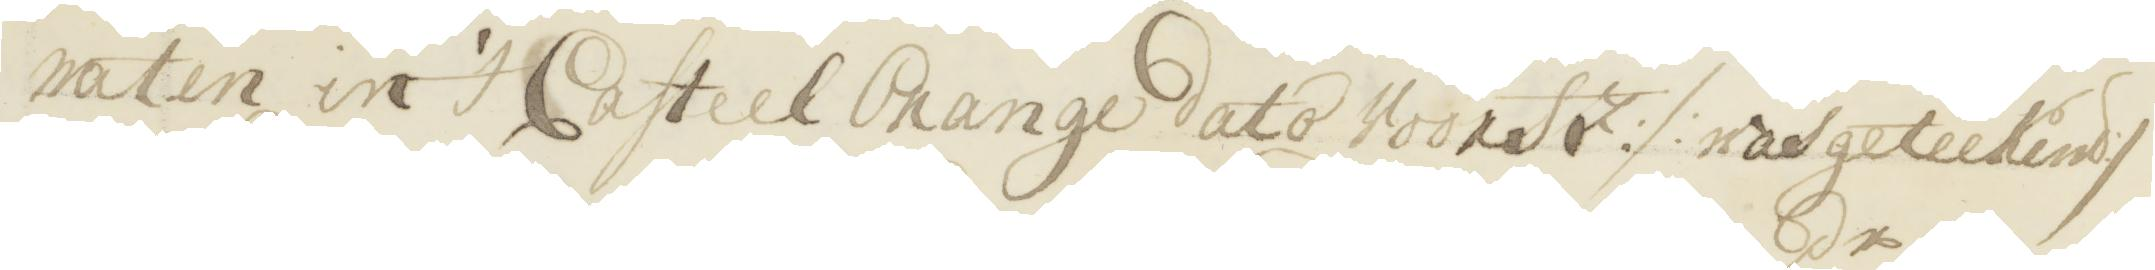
naten in ’t Casteel Orange dato voorsz: /:was geteekend:/
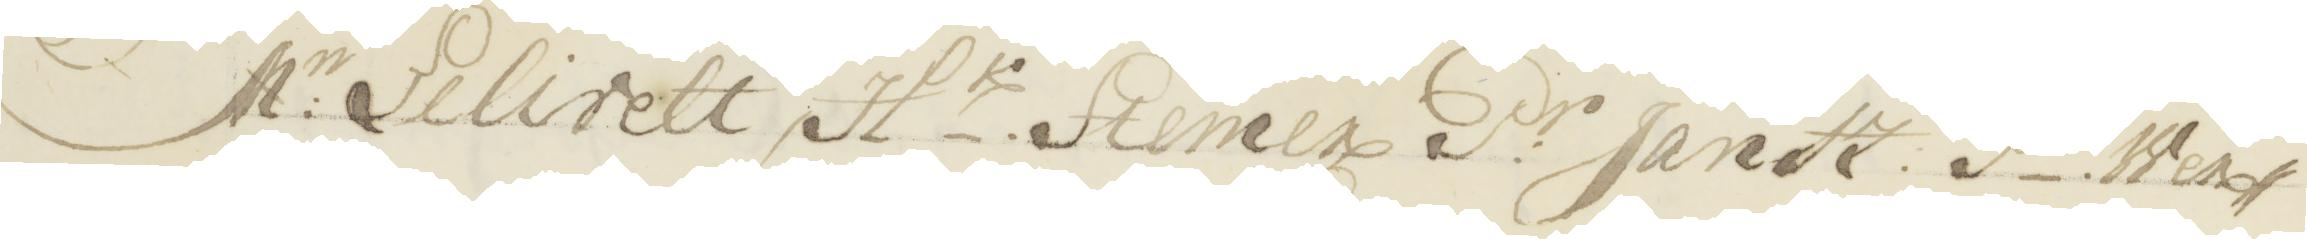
M:r Lelivelt, H–k. Stemer P:r Jansz: P–r. Wer
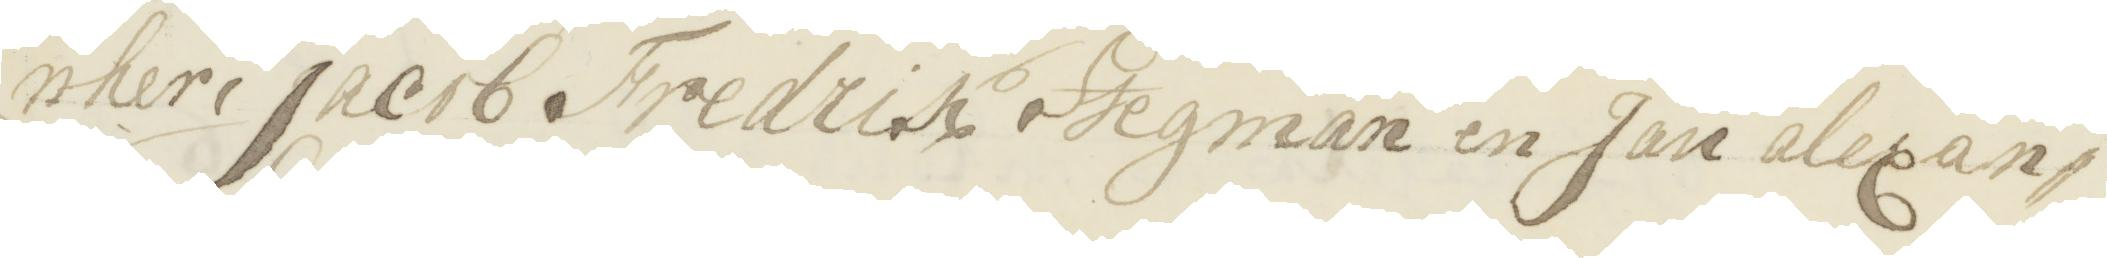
nher Jacob Fredrik Stegman en Jan alexan„
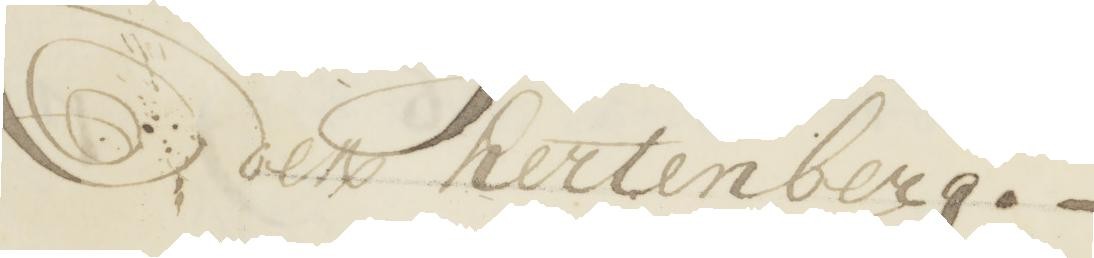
der hertenberg.
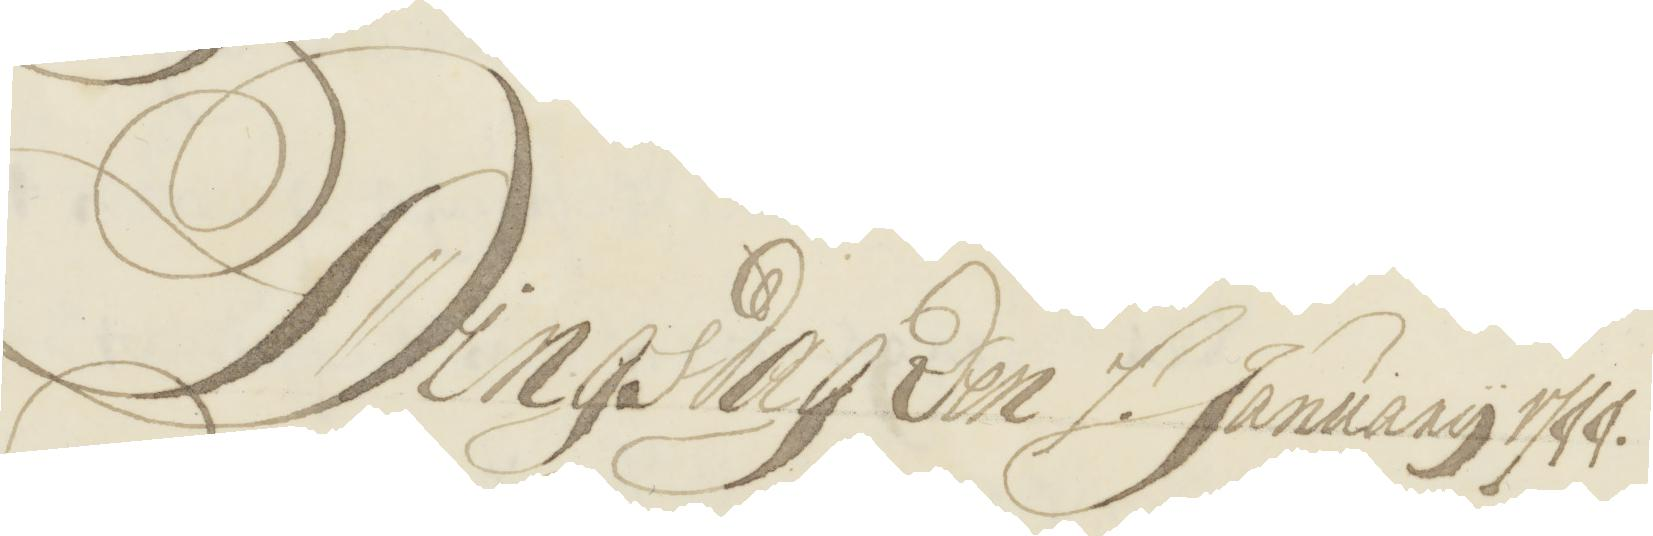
Dingsdag den 7.' Januarij 1744.
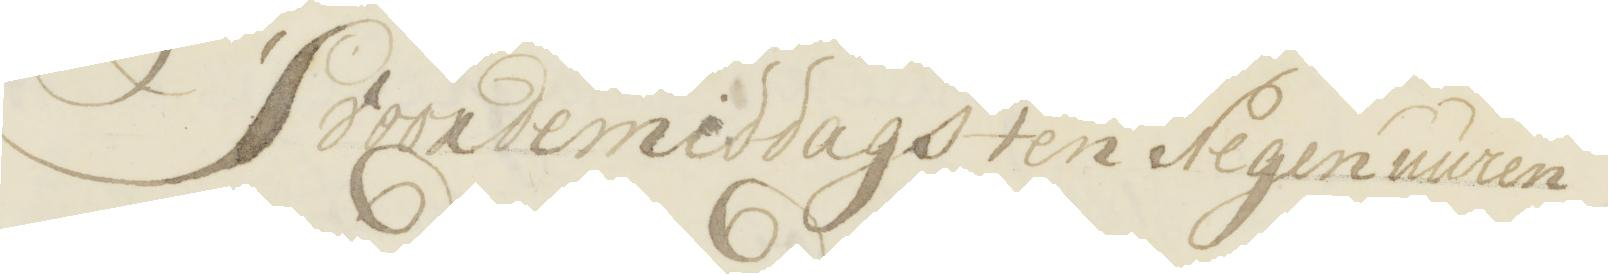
'S voordemiddags ten Negen uuren
